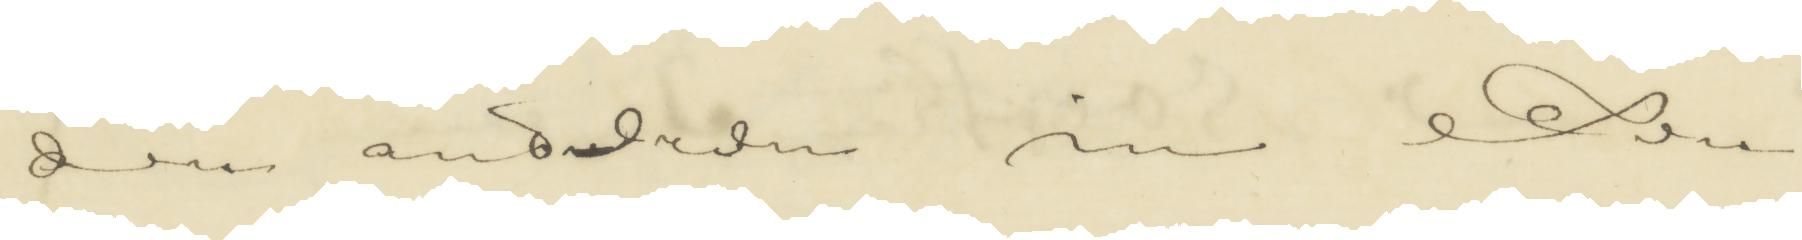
den anderen in Een
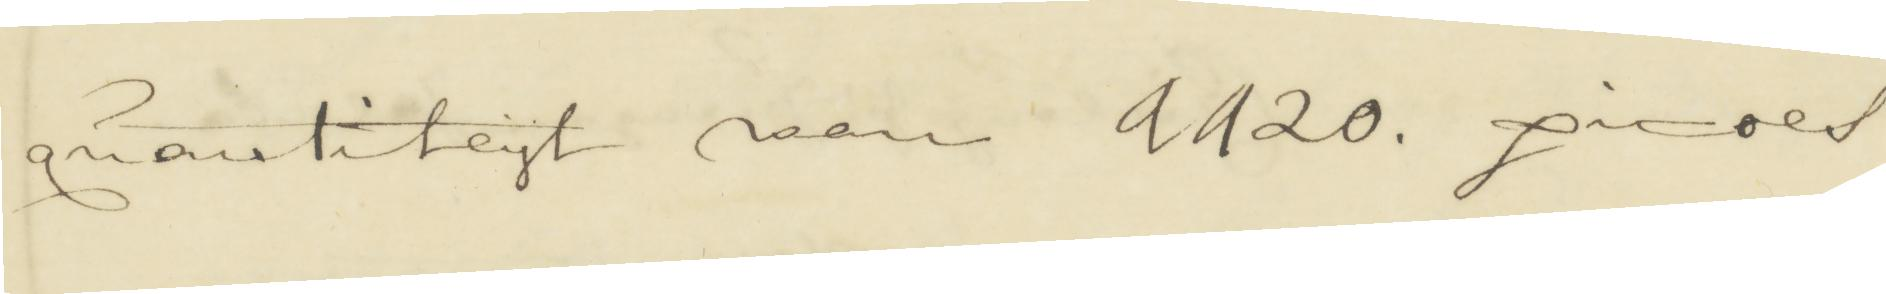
quantiteijt van 4420. picols
